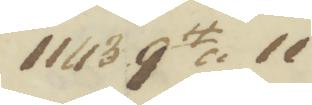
1143. 9tt a 11
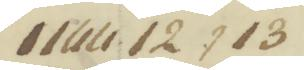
1144. 12. en 13
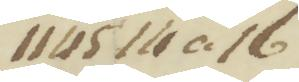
1145. 14 a 16
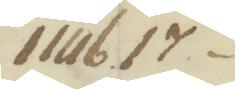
1146. 17.
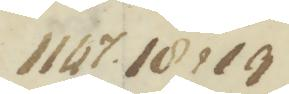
1147. 18 en 19
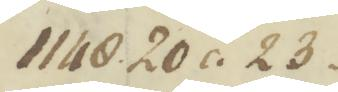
1148. 20 a 23
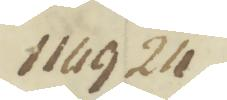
1149 24
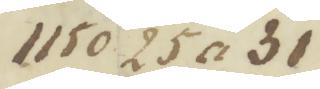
1150 25 a 31
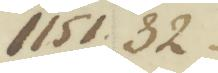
1151. 32
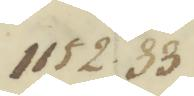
1152. 33
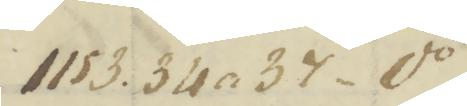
1153. 34 a 37 – do
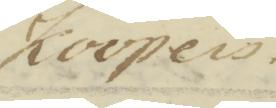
Kooper.
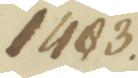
ƒ 1483.
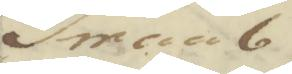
Smaat
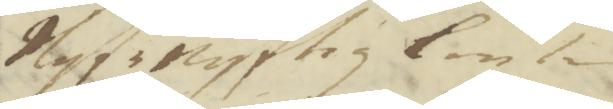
Vyf en vyftig Cents
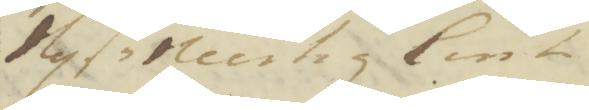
Vyf en veertig Cents
